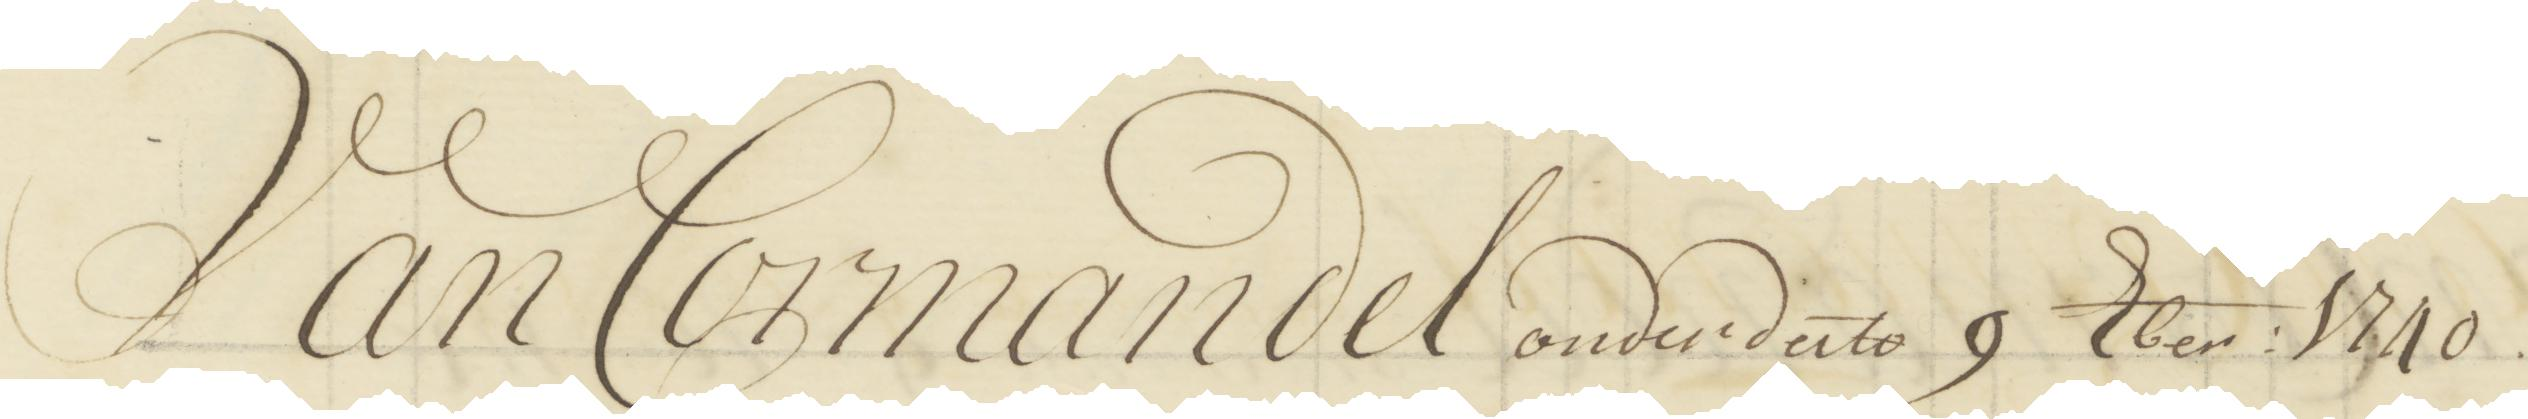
Van Cormandel onder dato 9 7ber: 1740.
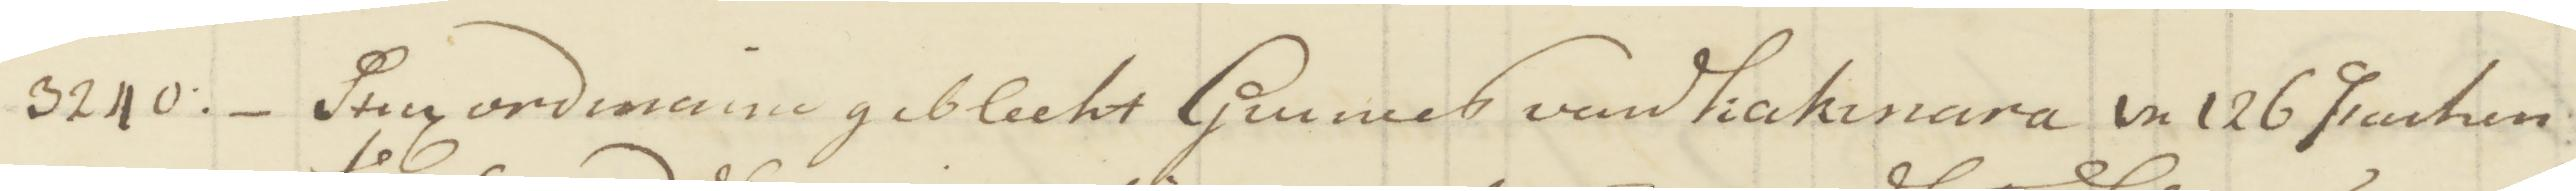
3240: — Stux ordinaire gebleekt Guinees van Niakinara in 126 packen
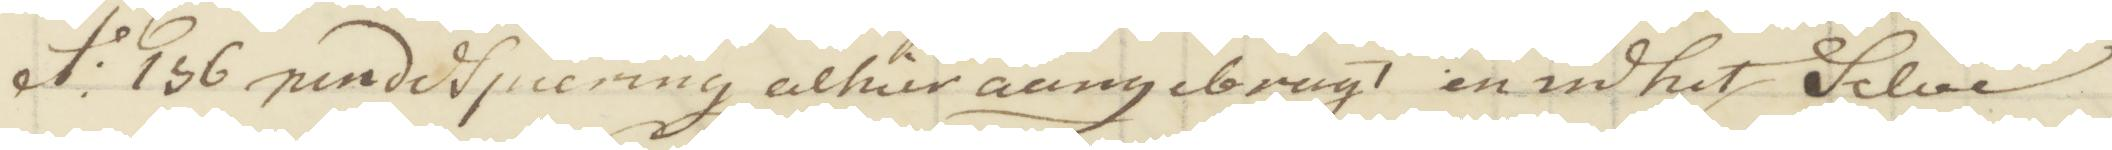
N:o 136 pindespiering alhier aangebragt en in het selve
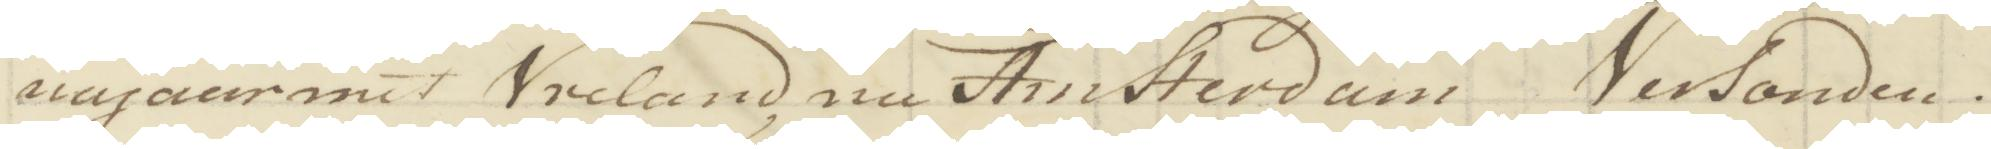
najaar met Vreland, na Amsterdam Versonden.
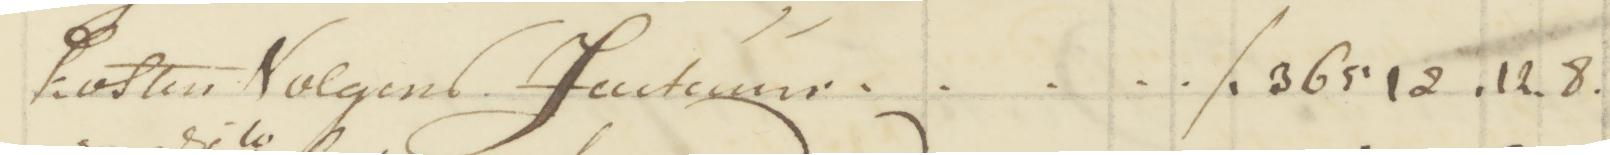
kosten Volgens Factuur . . . . . ƒ. 36512. 12. 8.
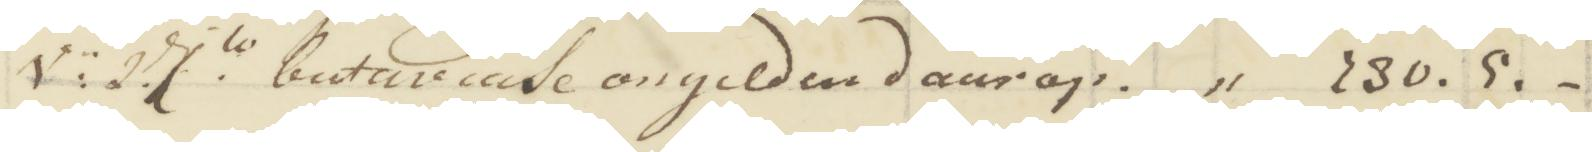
N:o 2. C.to bataviase ongelden daar op . „ 230. 5. —
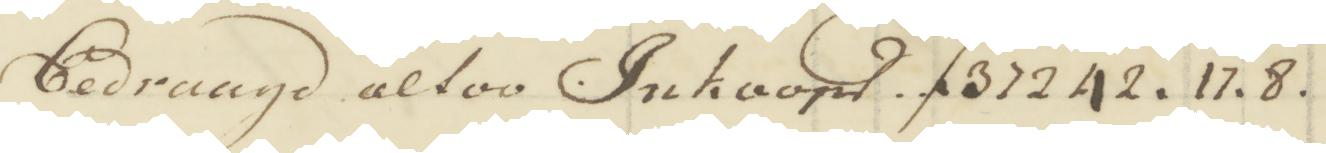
bedraagd alsoo Inkoops . . ƒ 37242. 17. 8.
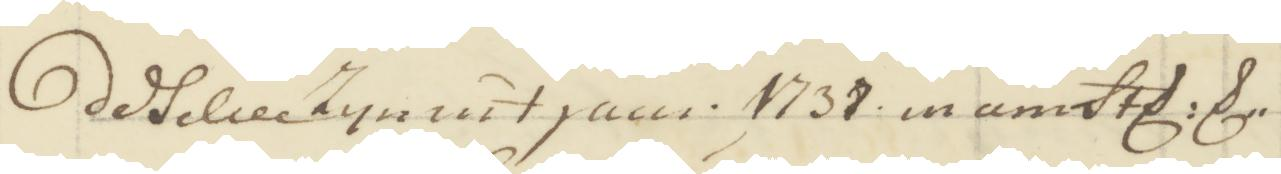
deselve Zyn in't jaar 1737. in amst: ver„
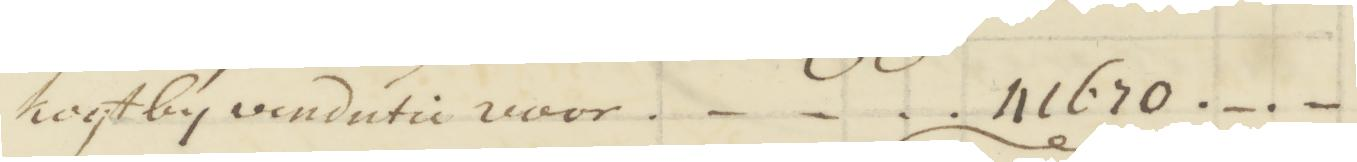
kogt by vendutie voor . - - . . 41670. —. —
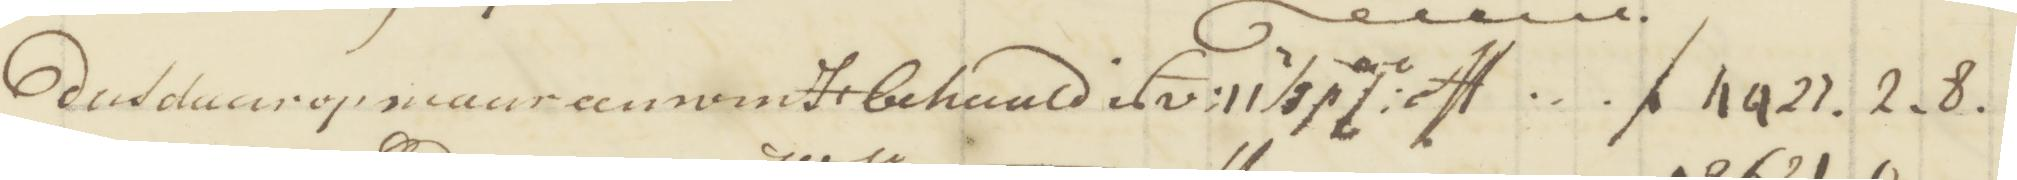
dus daarop maar een winst behaald is v; 11 2/3 per C:t oft . . . ƒ 4427. 2. 8.
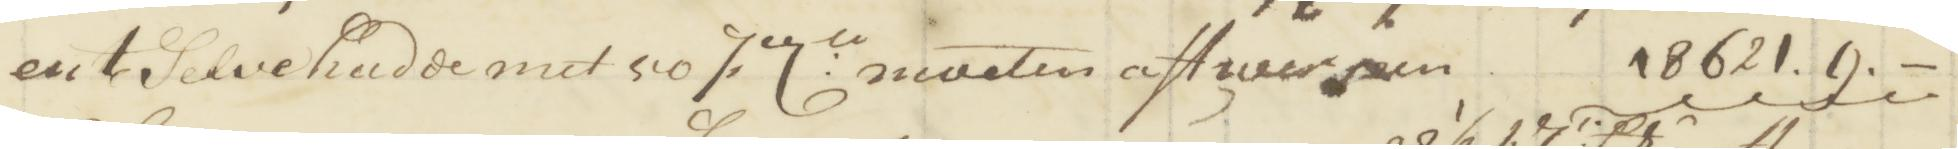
en t selve hadde met 50 p„r C:to moeten aftwer aen 18621. 9. —
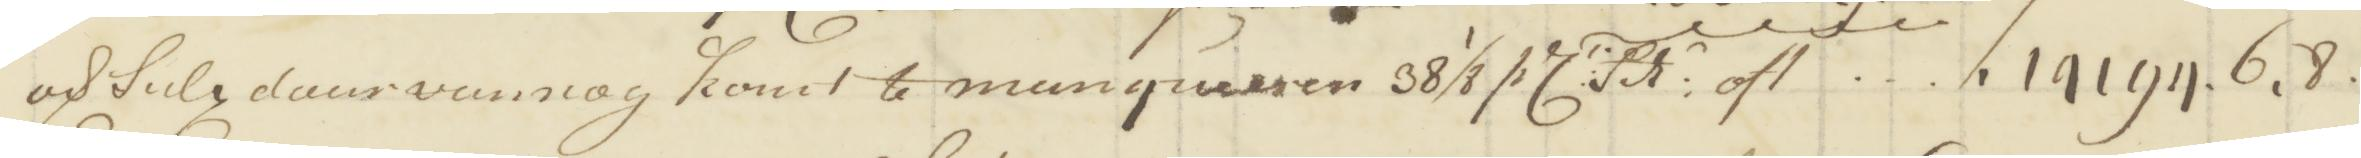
over sulx daar van nog komt te manqueeren 38 1/8 pr C:to st: oft . . . ƒ 14194. 6.8.
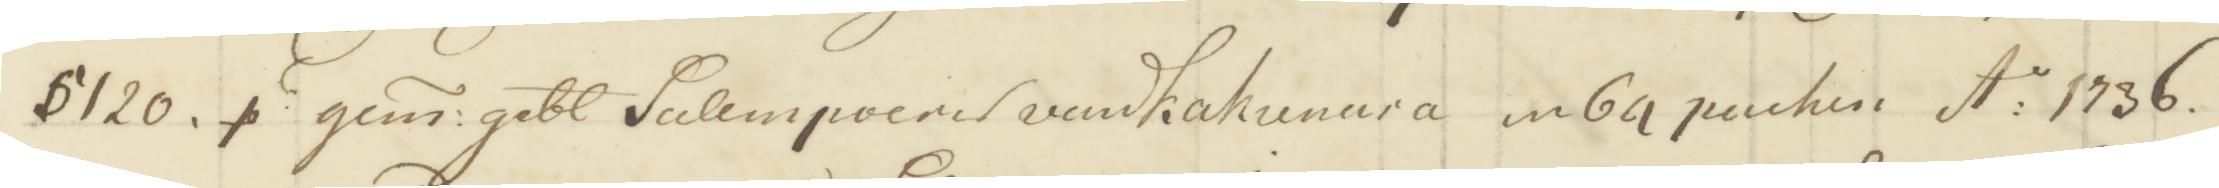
5120. p:' gem: gebl Salempoeris van Kakunara en 64 packen A:o 1736.
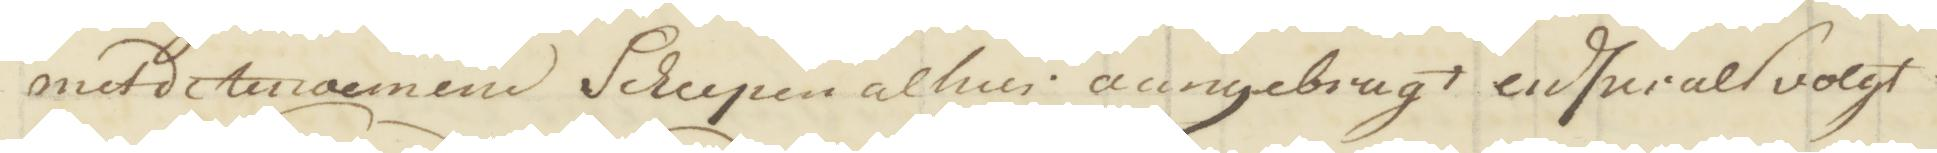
met de tenoemene Scheepen alhier aangebragt en per als volgt
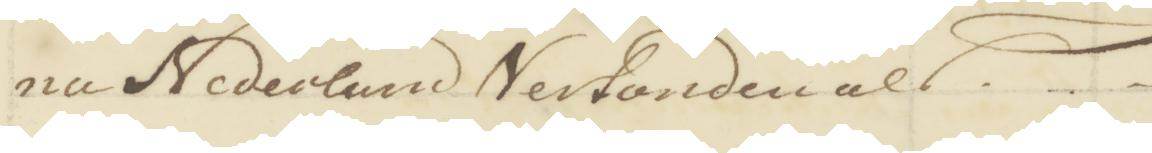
na Nederland Versonden als . . . —
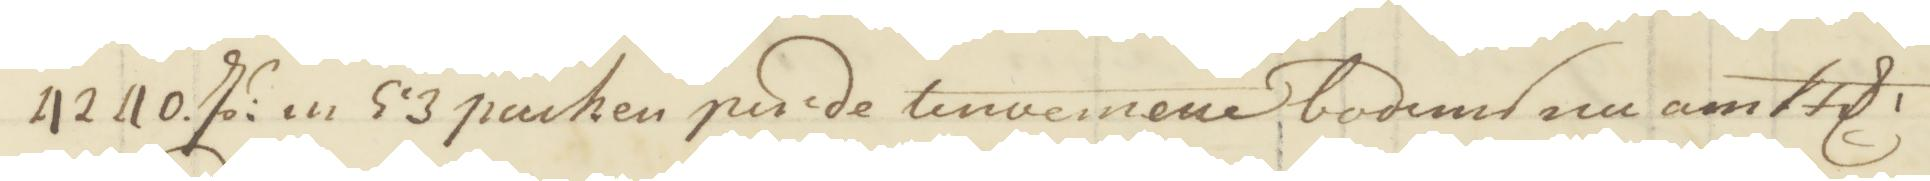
4240. p:' in 53 packen per de tenoemene bodems na amst:
